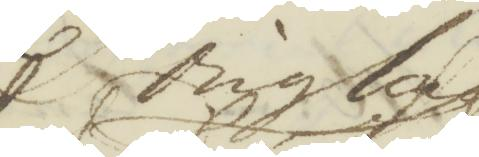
J Douglas
